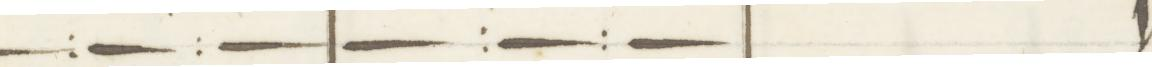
—:—:— —:—:— 1
